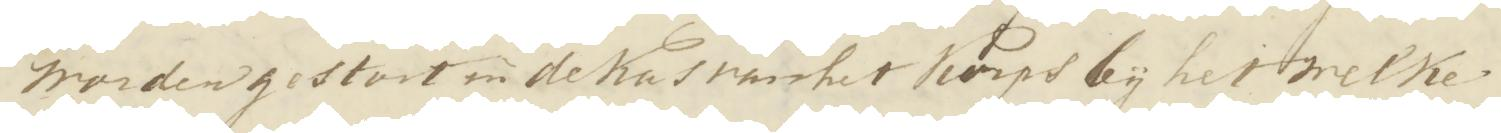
worden gestort in de kas van het van het Korps bij het welke
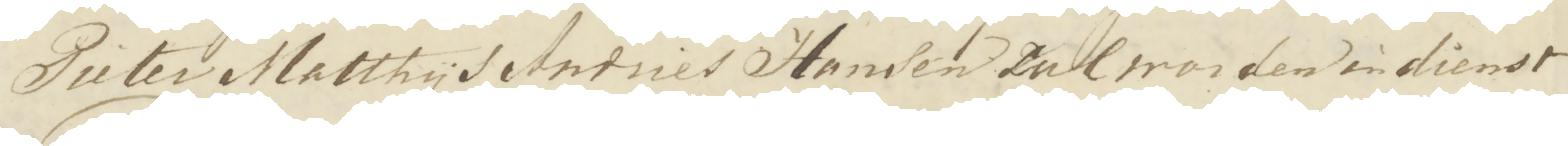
Pieter Matthijs Andries Hansen zal worden en dienst
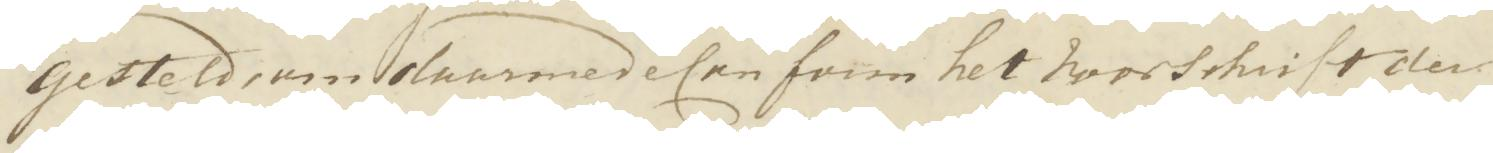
gesteld, en daarmede Conform het voorschrift der
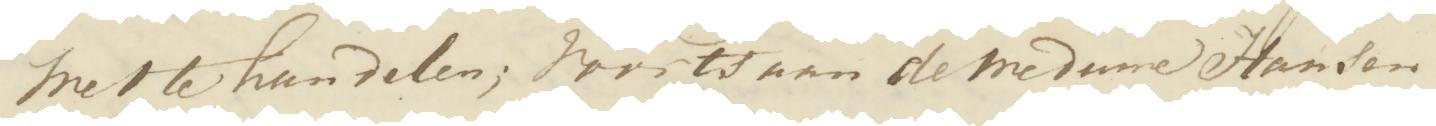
wet te handelen; voorts aan de weduwe Hansen
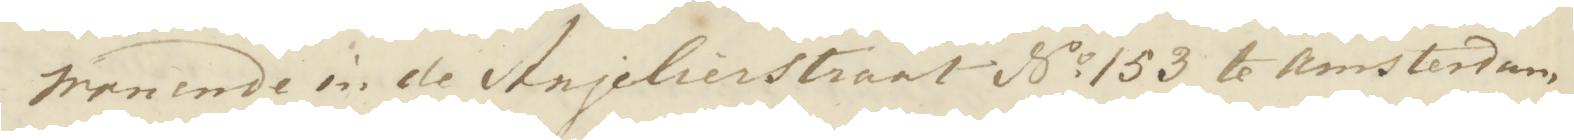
wonende in de Anjelierstraat N.o 153 te Amsterdam
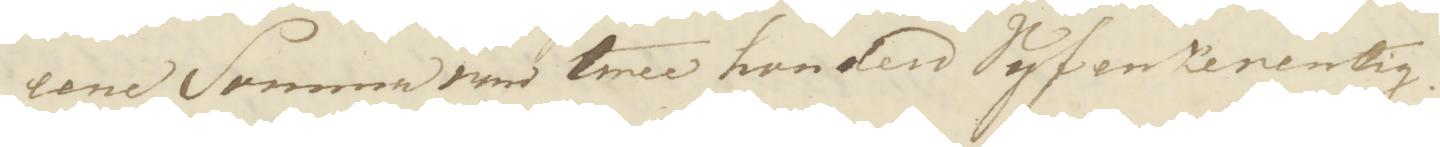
eene sommma van twee honderd Vyf en zeventig
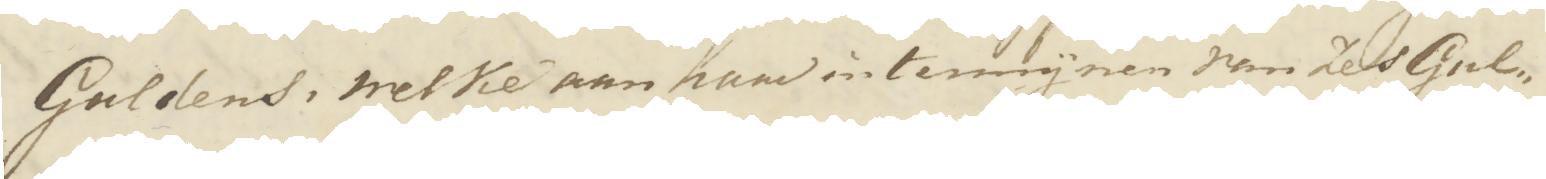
Guldens, welke aan hun in tenmijnen van Zes Gul„
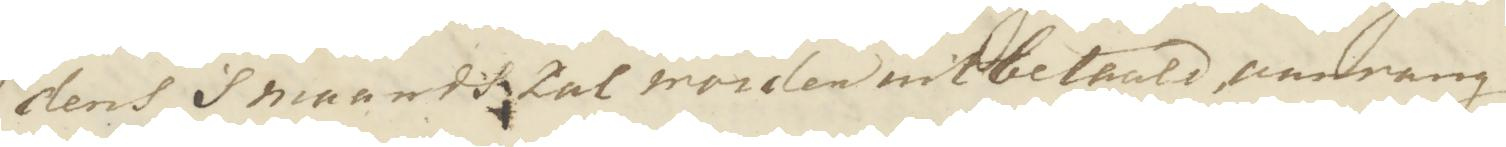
dens 's maand's zal worden uitbetaald, aanvang
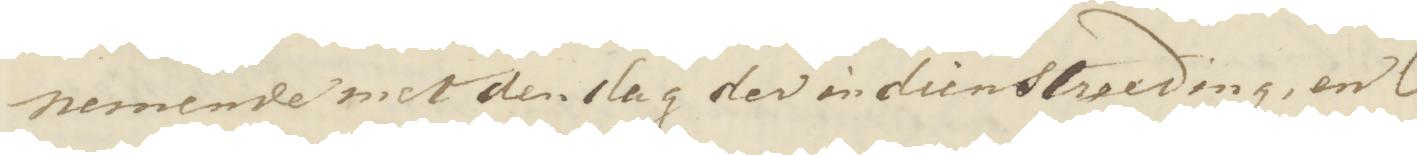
nemende met den dag der in dienstreeding, en
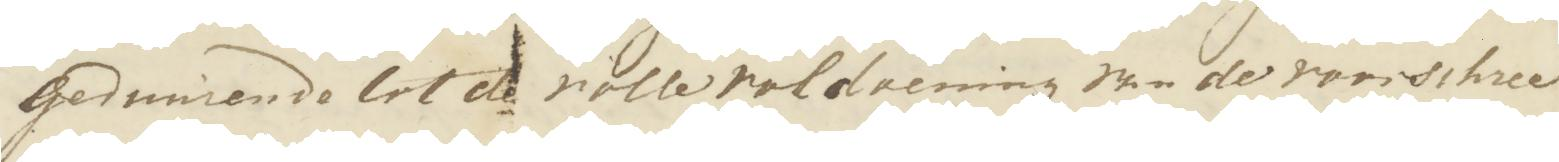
Geduurende tot de volle voldoening van de voorschree
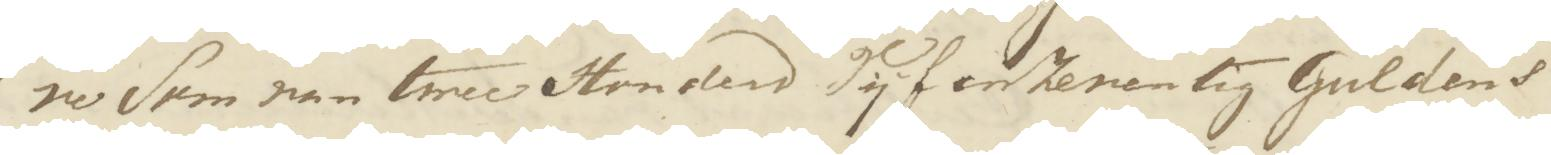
ve Som van Twee Honderd Vijf en zeventig Guldens
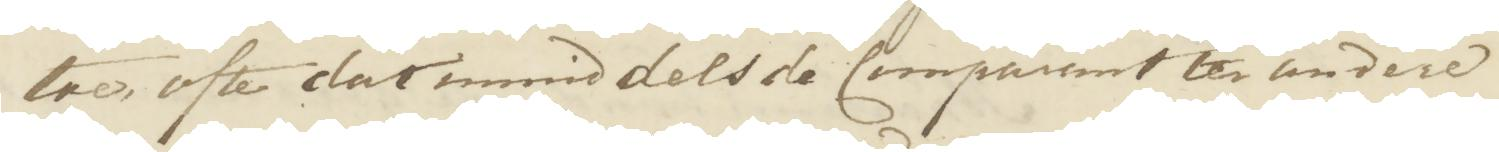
tre, ofte dat inmiddels de Comparant ten andere
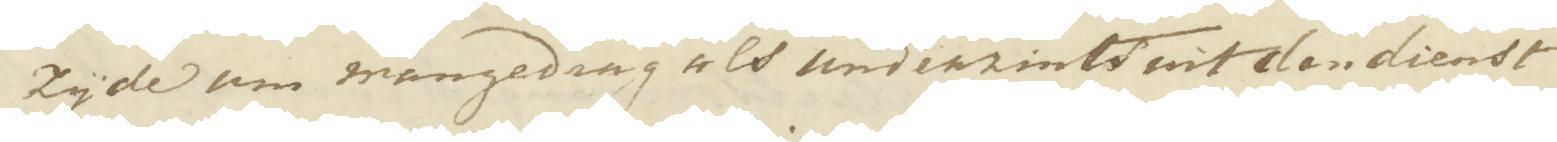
zijde om wangedrag als anderzints uit den dienst
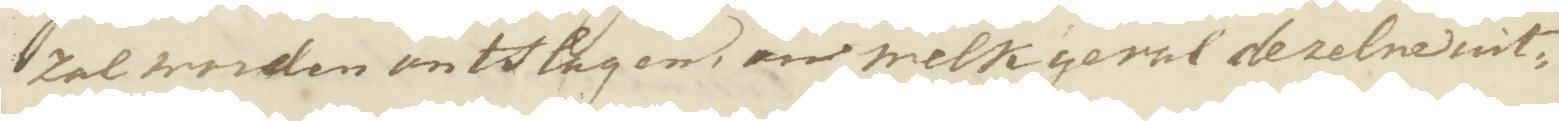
zal worden ontslagen, in welk geval dezelve uit„
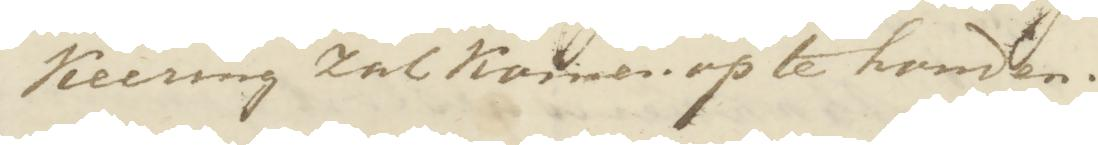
keering zal komen op te houden.
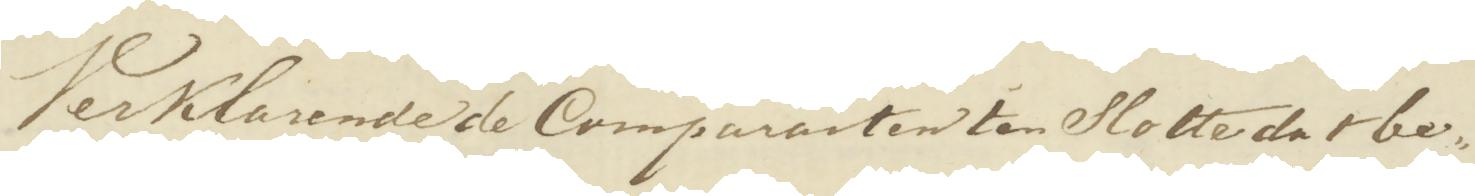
Verklarende de Comparanten ten Slotte dat be„
